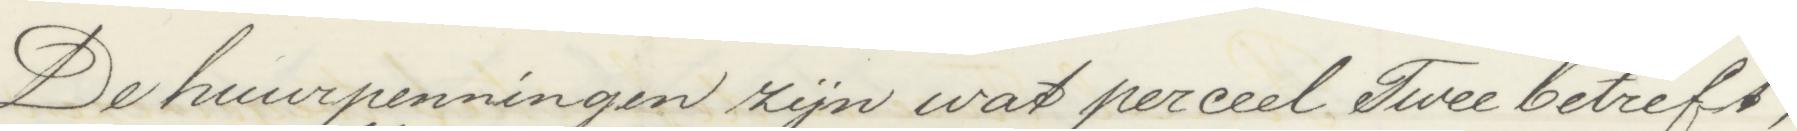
De huurpenningen zijn wat perceel Twee betreft,
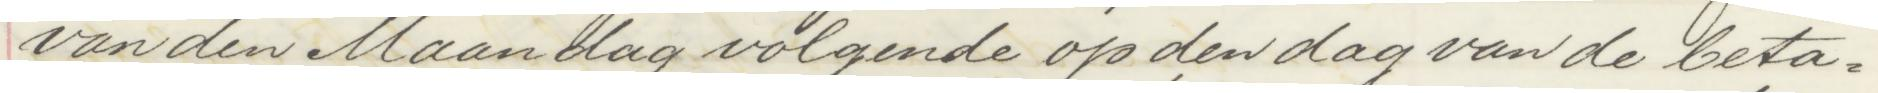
van den Maandag volgende op den dag van de beta„
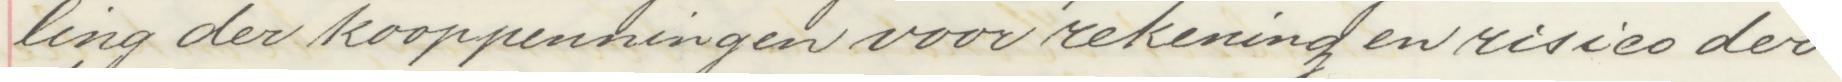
ling der kooppenningen voor rekening en risico der
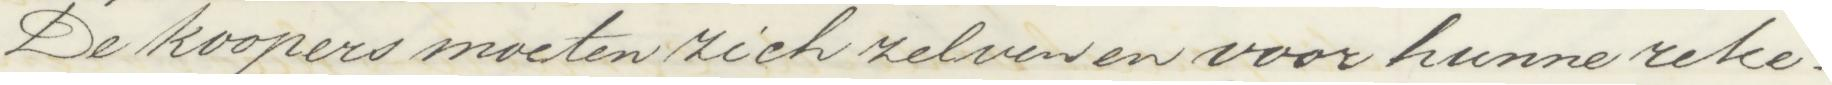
De koopers moeten zich zelven en voor hunne reke=
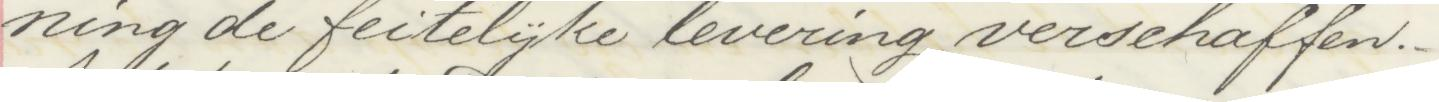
ning de feitelijke levering verschaffen.
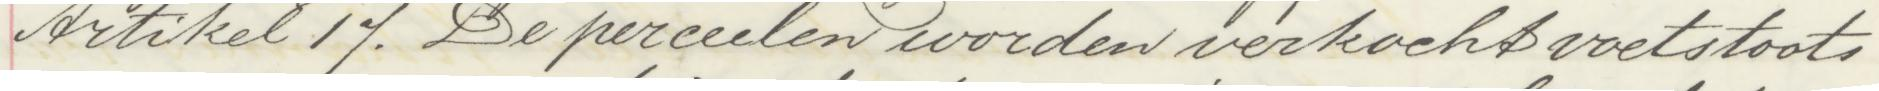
Artikel 17. De perceelen worden verkocht voetstoots
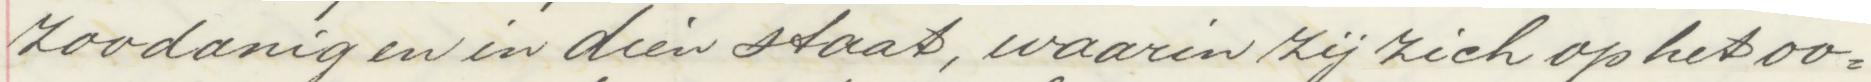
zoodanig en in dien staat, waaren zij zich op het oo=
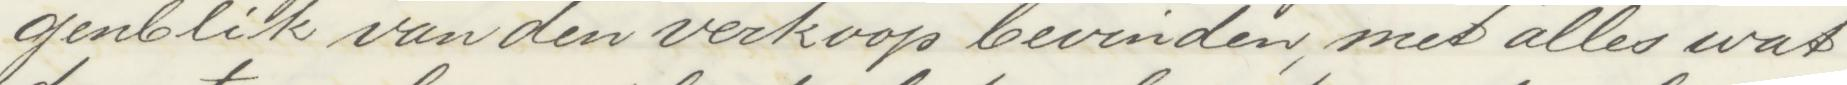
genblik van den verkoop bevinden, met alles wat
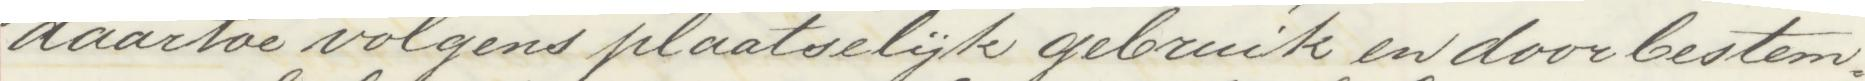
daartoe volgens plaatselijk gebruik en door bestem„
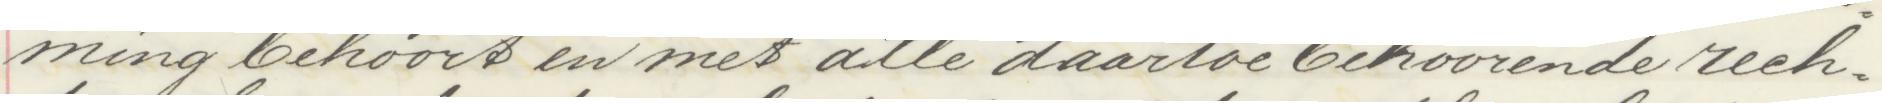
ming behoort en met alle daartoe behoorende rech=
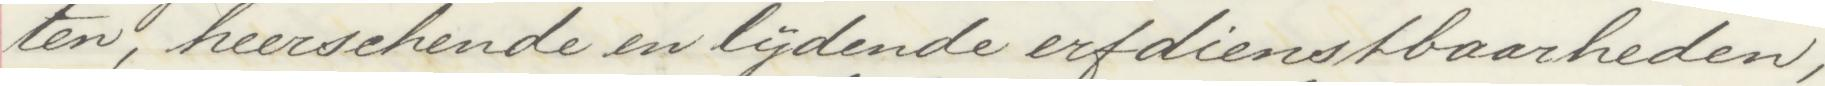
ten, heerschende en lijdende erfdienstbaarheden,
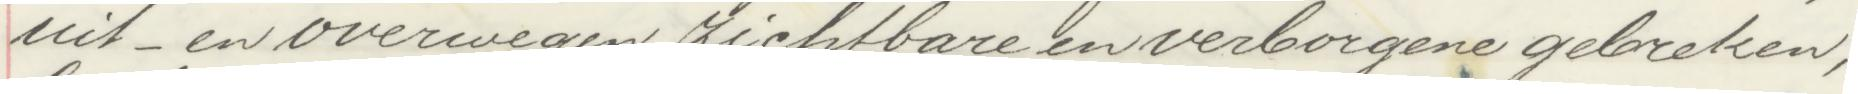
uit - en overwegen, zichtbare en verborgene gebreken,
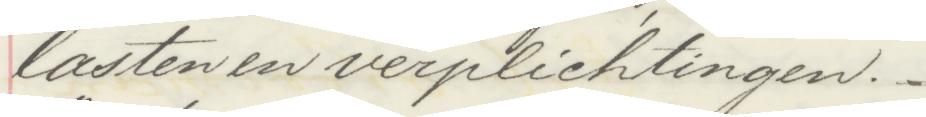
lasten en verplichtingen.-
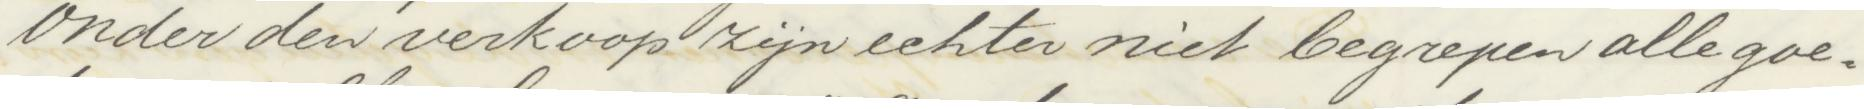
Onder den verkoop zijn echter niet begrepen alle goe=
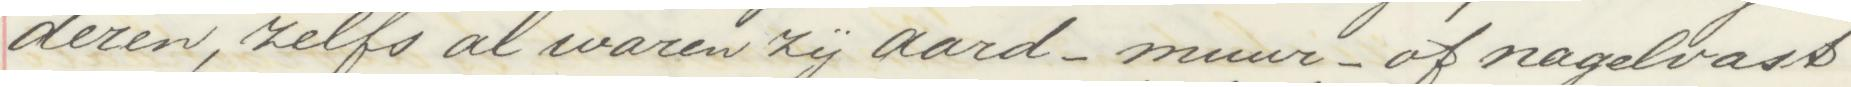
deren, zelfs al waren zij aard- muur- of nagelvast
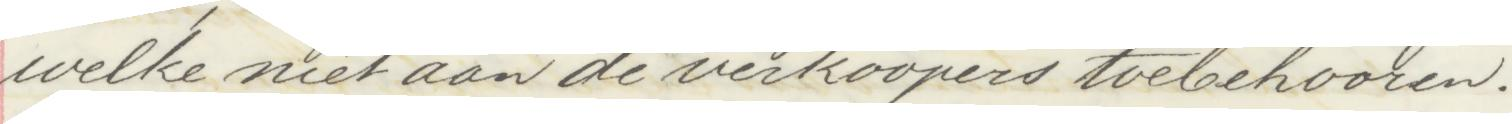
welke niet aan de verkoopers toebehooren.
